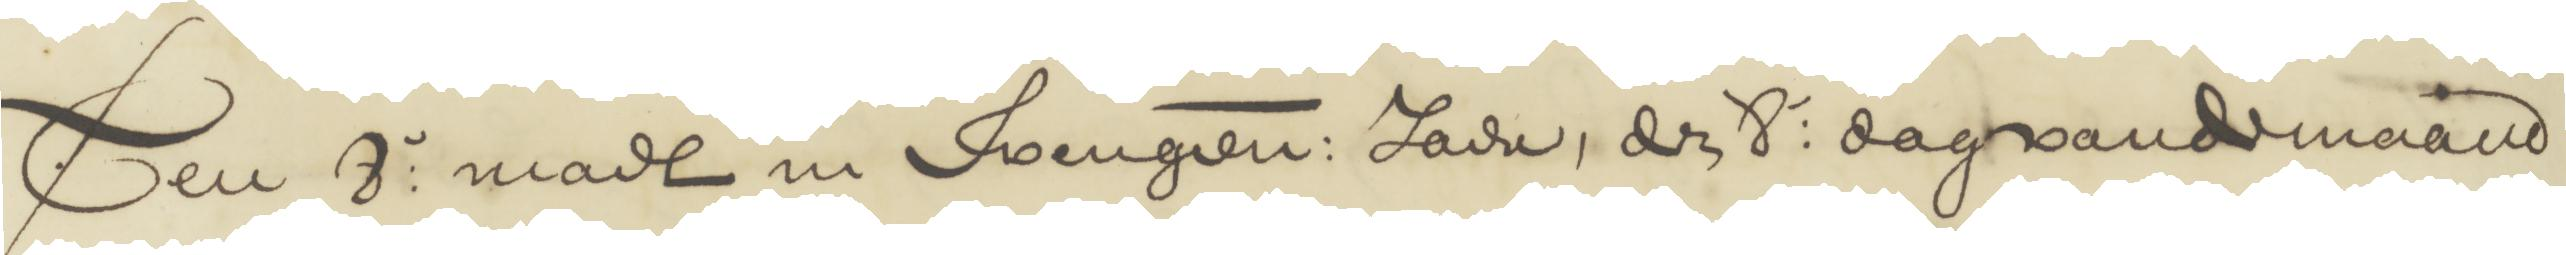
Ten 8:' mael in Evengen: Iaer, den 8:' dag van de maand
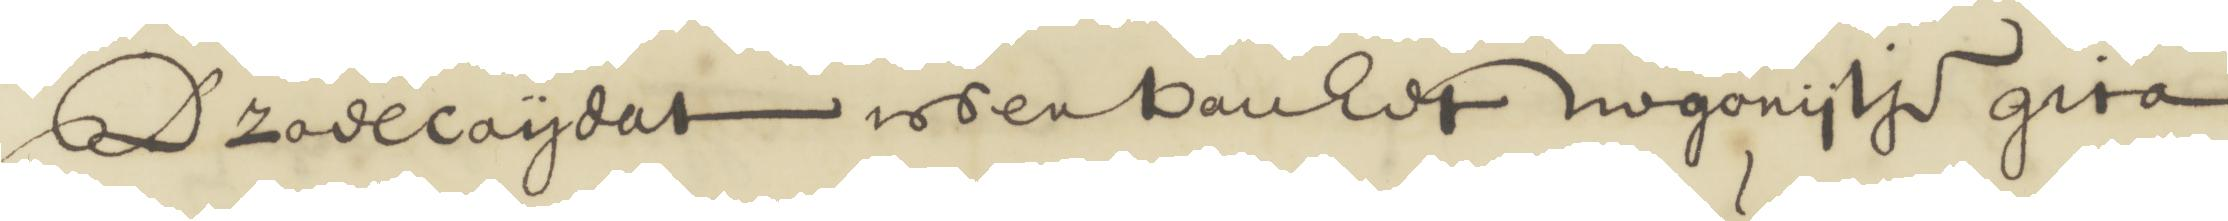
D zoelcaij dat isser van het negorijtje gita
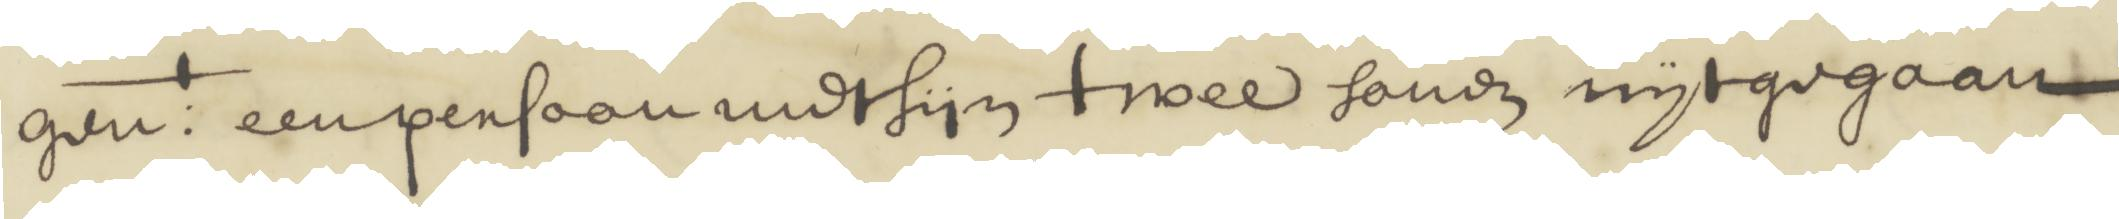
gen:t een persoon met sijn twee sonen uijtgegaan
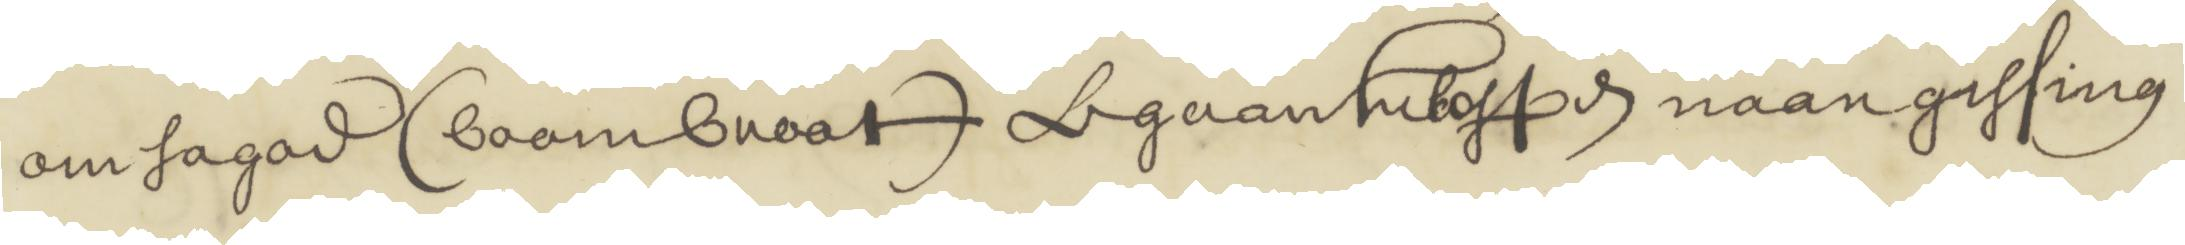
om sagoe (boombroot) te gaan kloppen naar gissing
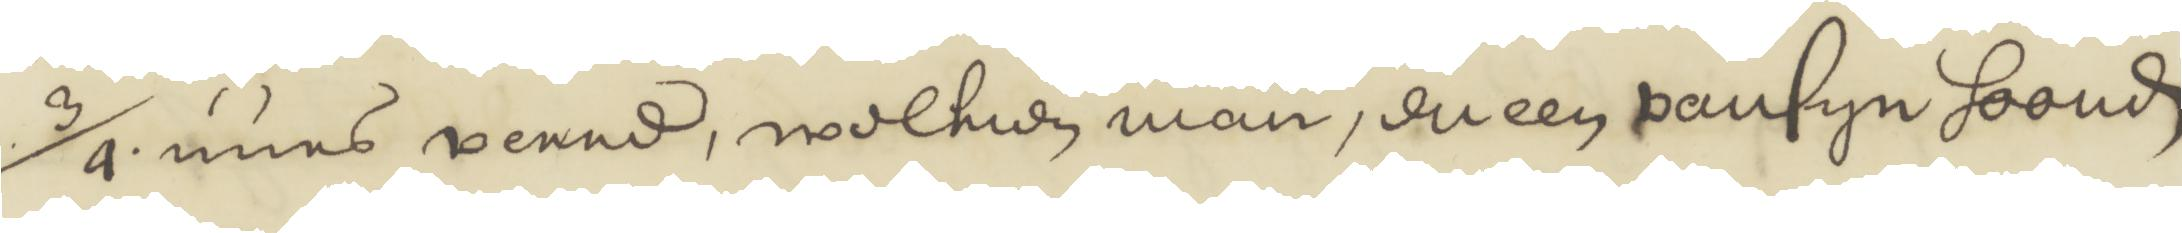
¾. uurs verre, welken man, en een van syn soonen
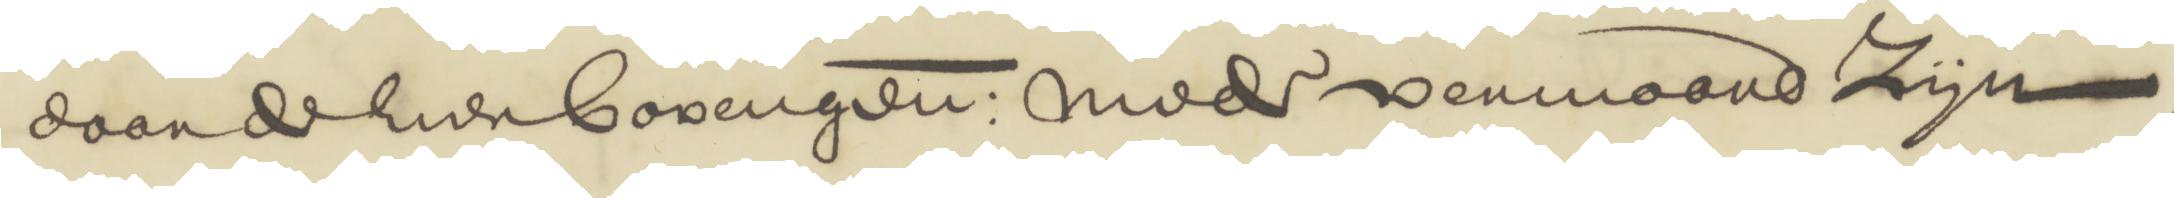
door de hier boven gen: mede vermoord Zijn,
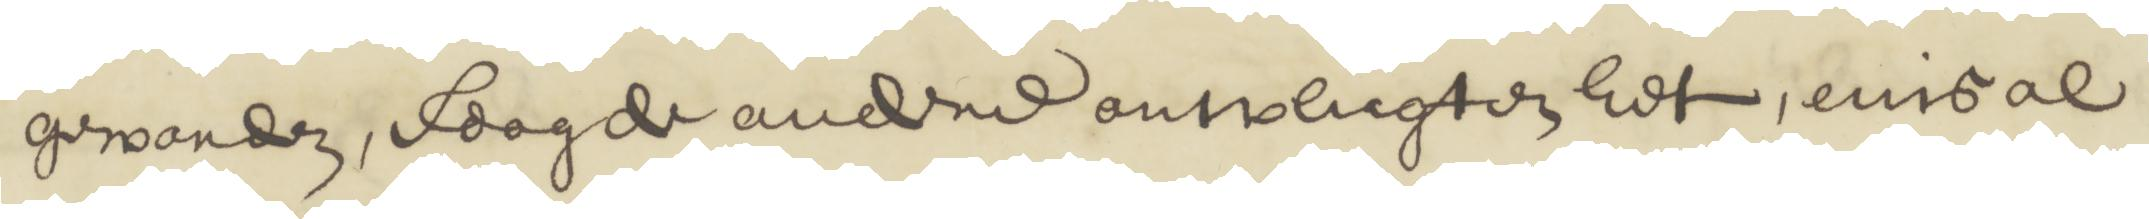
geworden, Edogde andere ontvlugten het, en is al
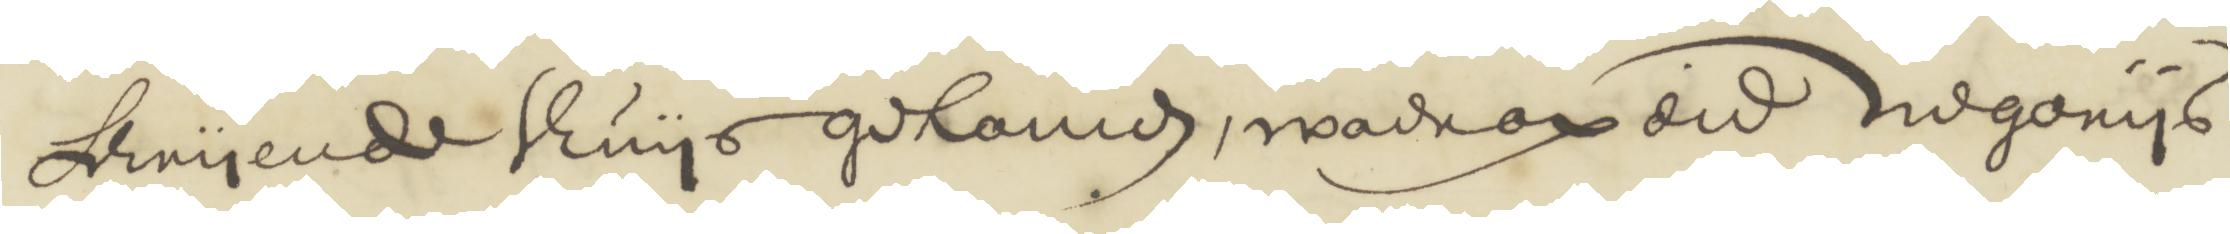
schrijende thuijs gekomen, waer op die negorijs
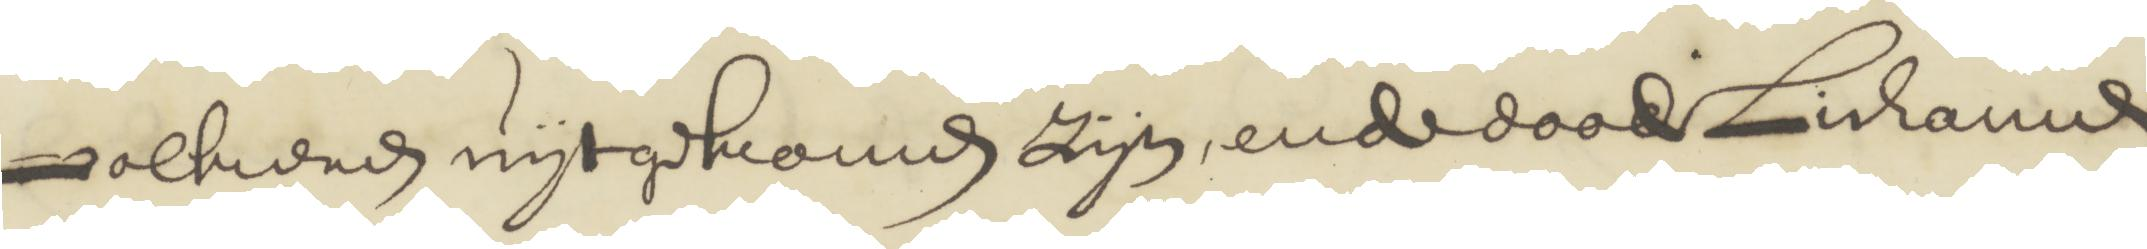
volkeren uijtgekomen zijn, en de doode Lithannen
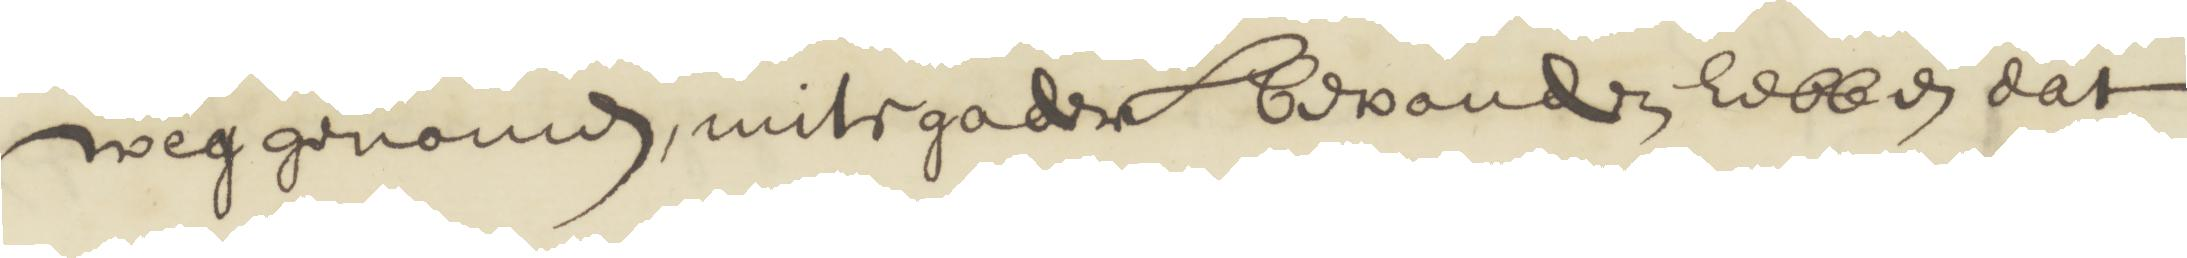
weg genomen, mitsgaders bevonden hebben dat
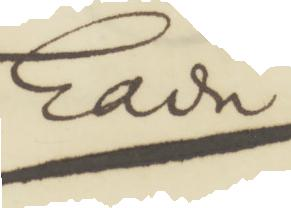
haer
